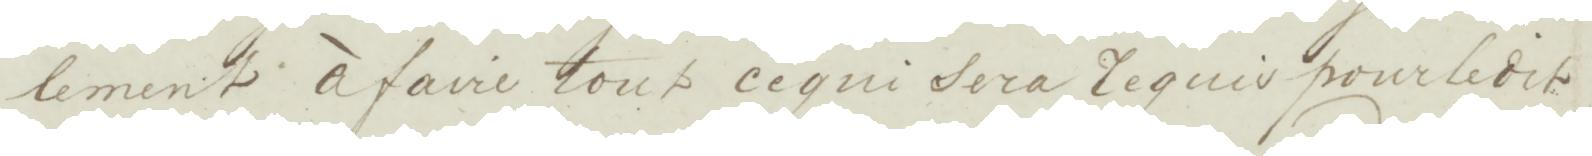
lement à faire tout cequi sera requis pour ledit
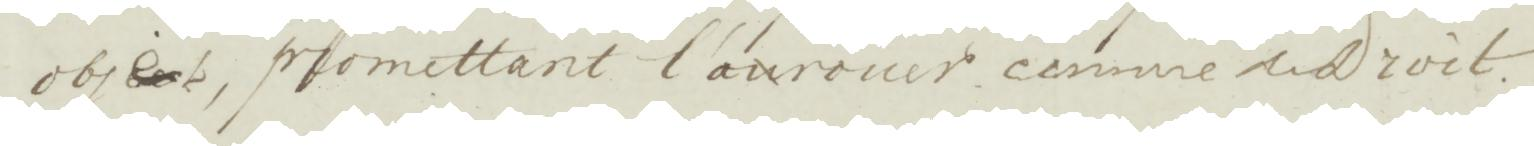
objet, promettant l'auvouer comme le Droit.
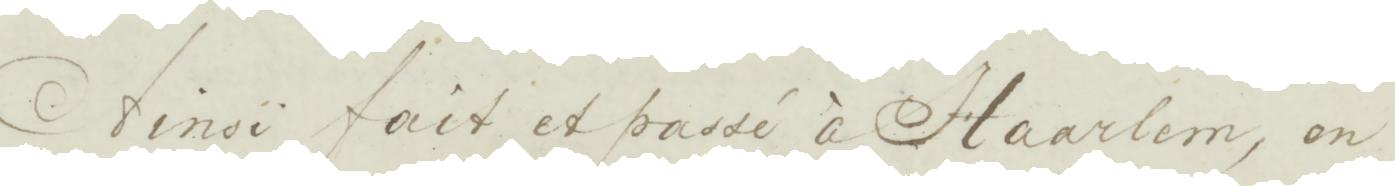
Ainsi fait et passé à Haarlem, en
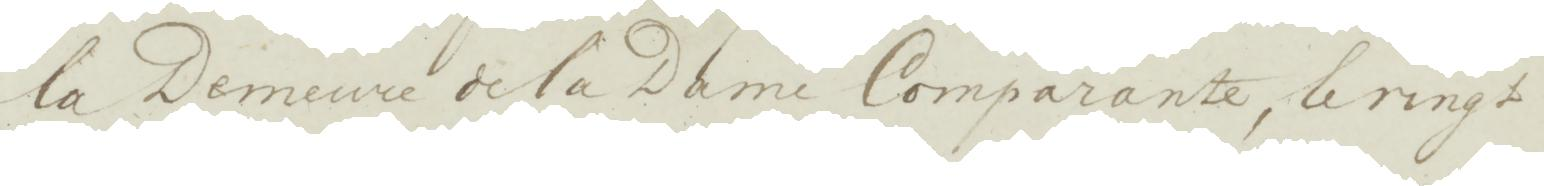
la Demeure de la Dame Comparante, le vingt
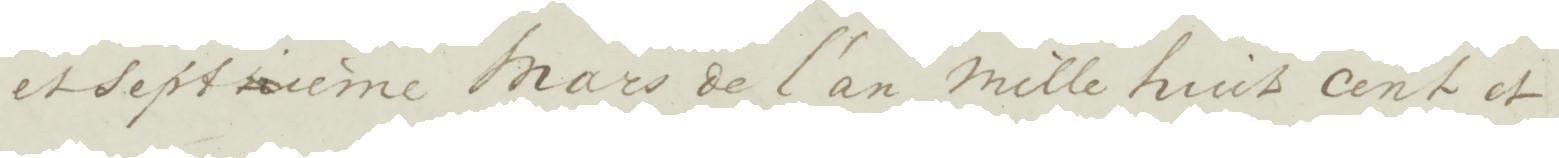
et septtrième Mars de l'an mille huit cent et
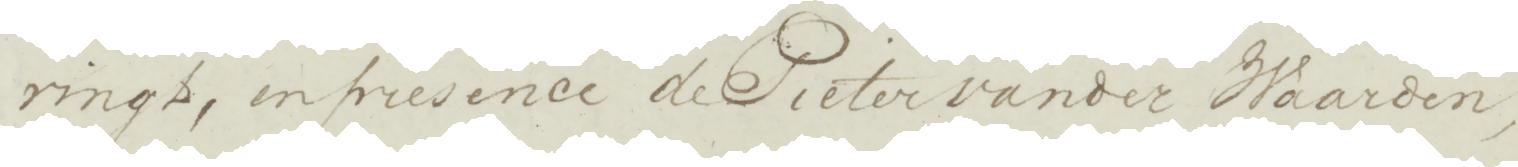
vingt, en présence de Pieter vander Waarden,
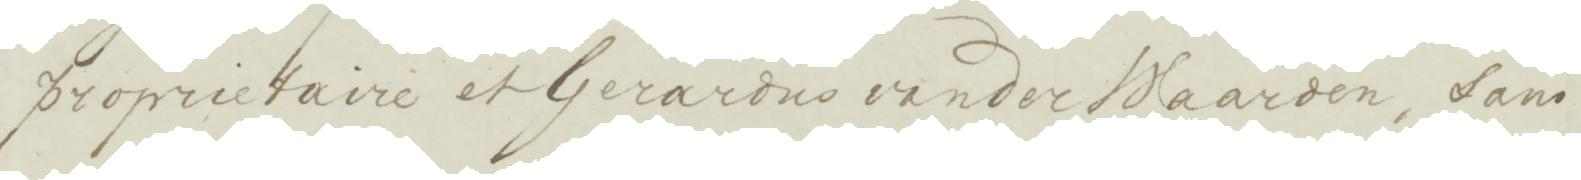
proprietaire et Gerardus vander Waarden, Sans
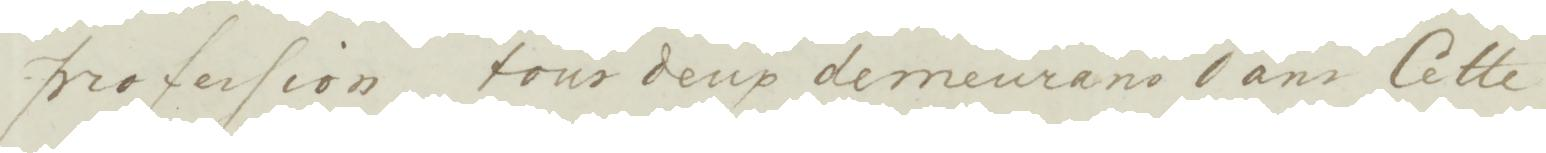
profession, tous deux demeurans dans Cette
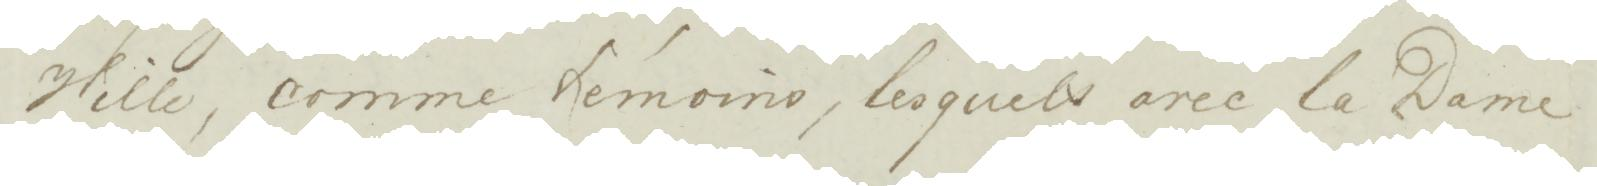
Ville, comme Témoins, lesquels avec la Dame
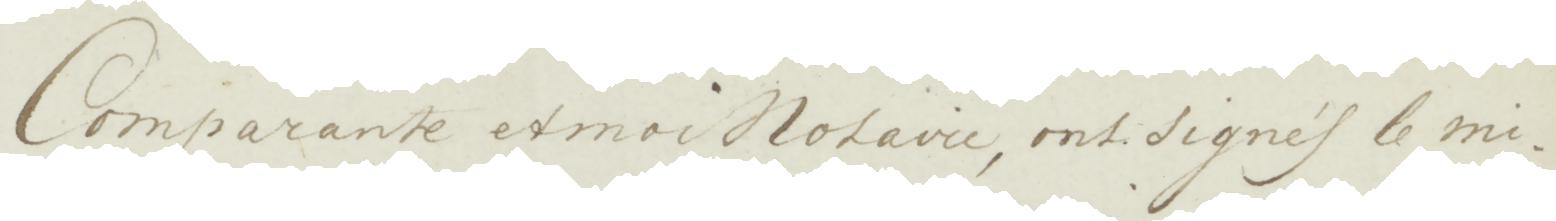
Comparante et moi Notaire, ont signés te mi-
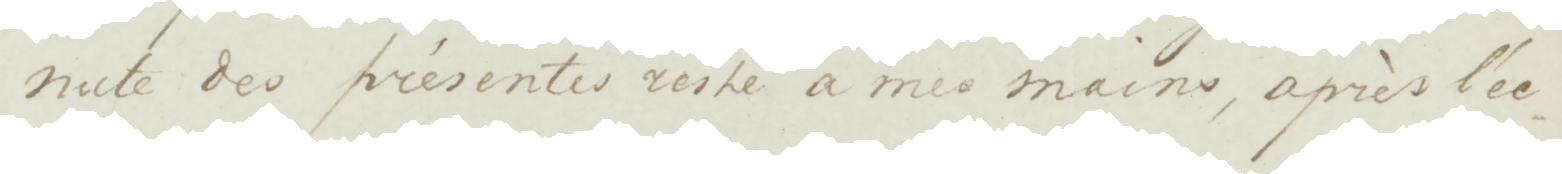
nute des présentes resté a mes mains, après l'ec„
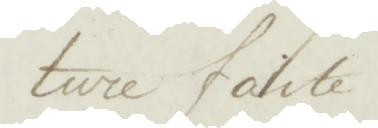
ture faite
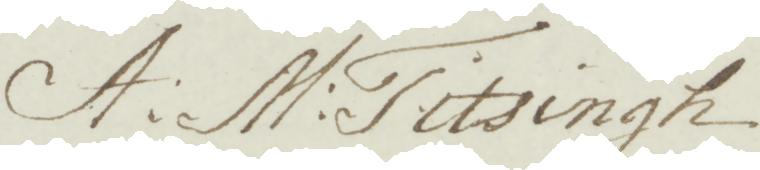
A: M: Titsingh
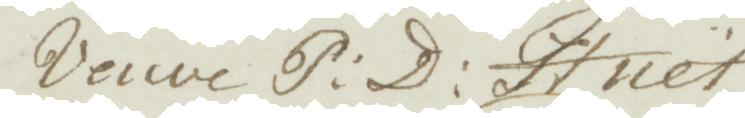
Veuve P: D: Huet
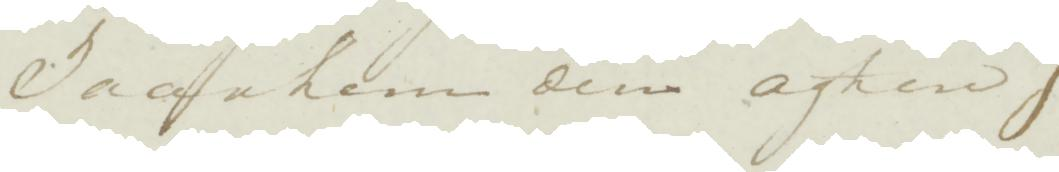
Iaarlem den agt en
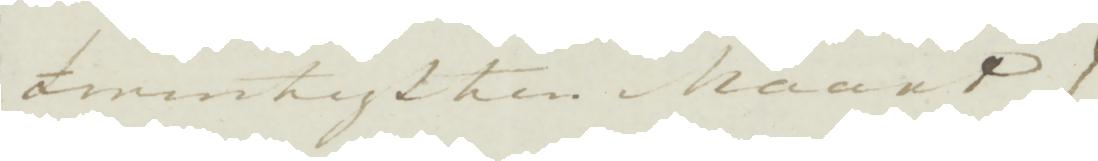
twintigsten Maart
